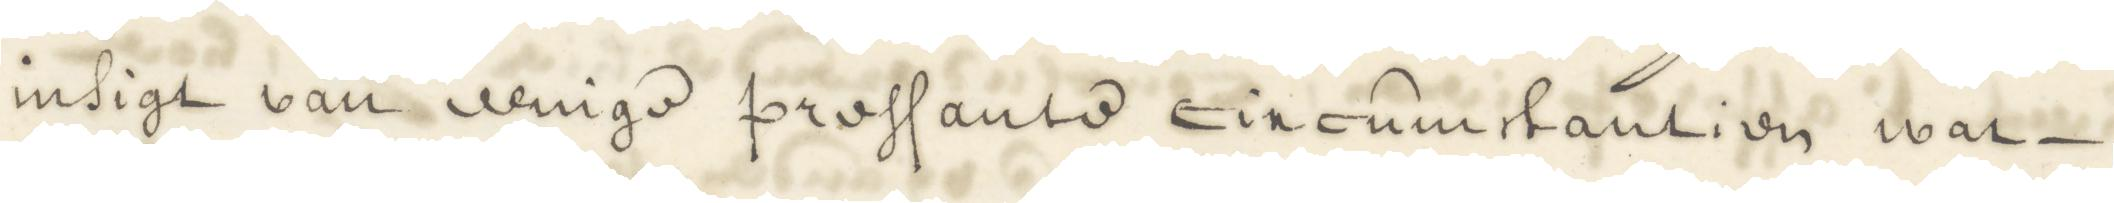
insigt van eenige pressante circumstantien wat –
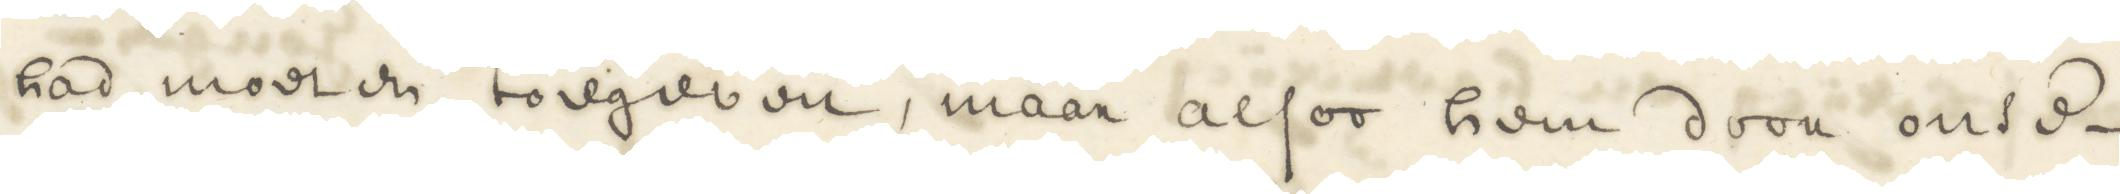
had moeten toegeven, maar alsoo hem door onse –
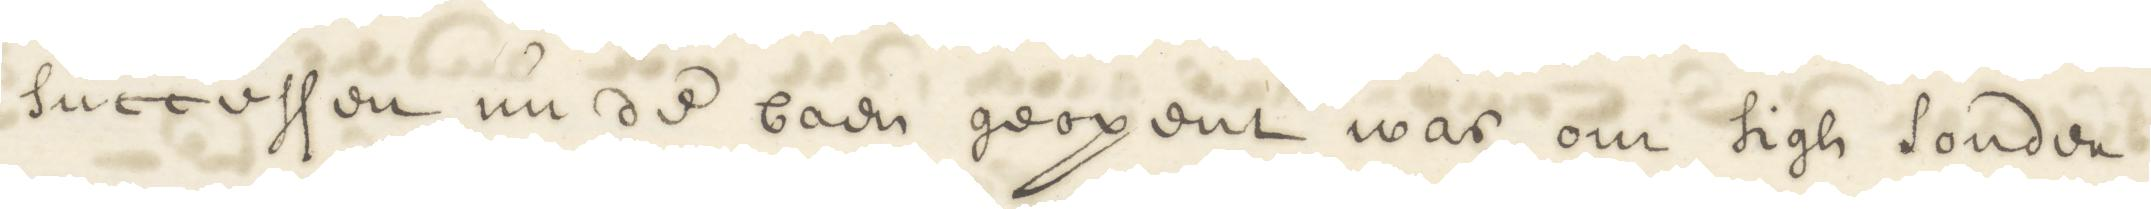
successen nu de baen geopent was om sigh sonder
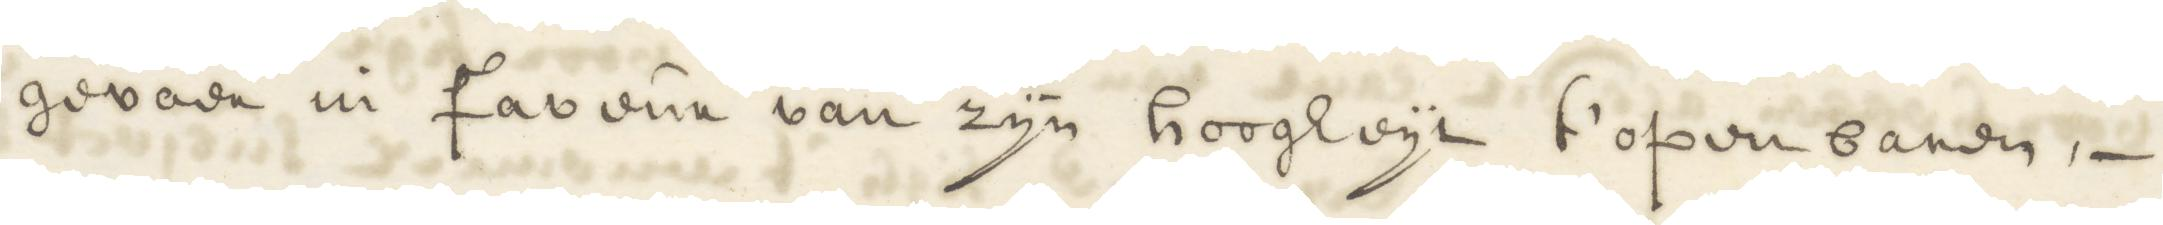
gevaer in faveur van zijn hoogheijt t' openbaren, –
